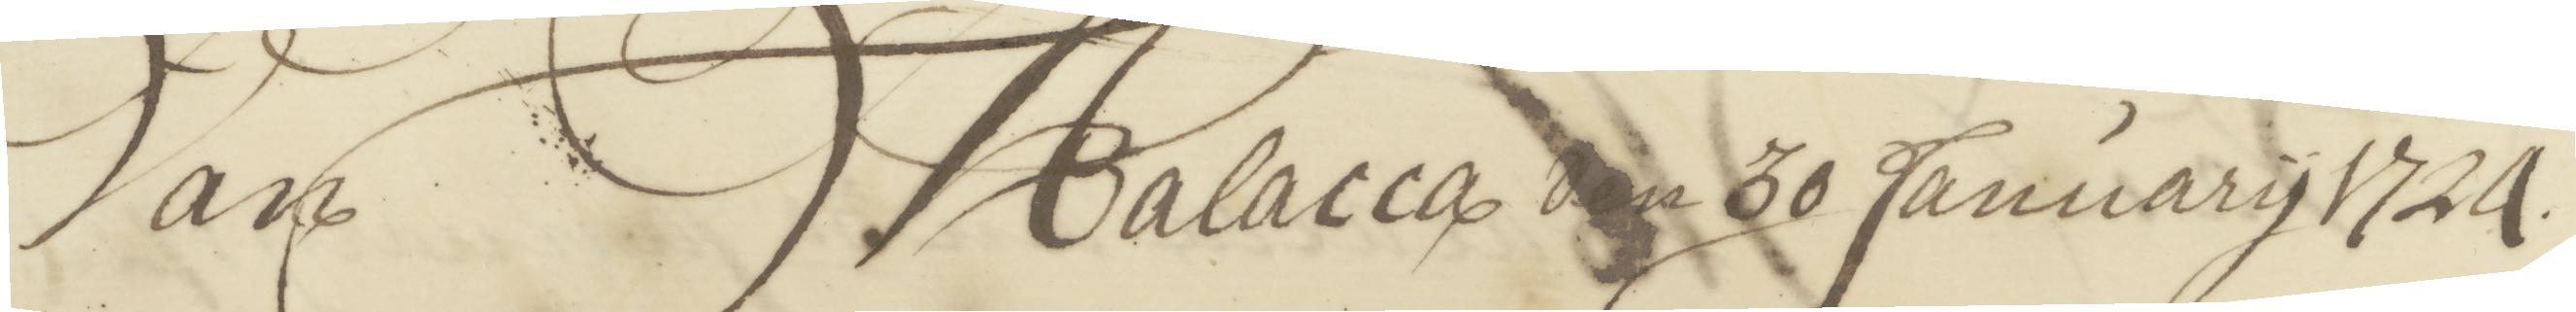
Van Malacca dese 30 Januarij 1724.
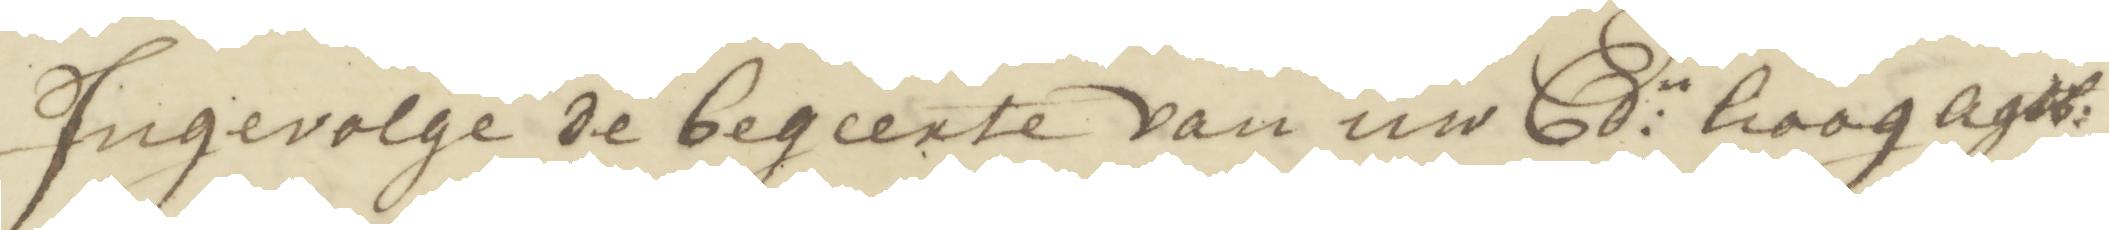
Jngevolge de begeerte van uw Ed:n hoog agtb:
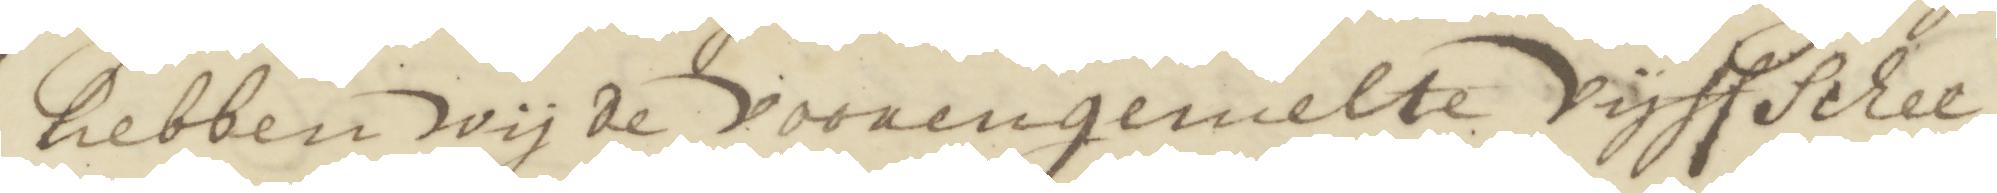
hebben wij de voorengemelte vijff schee
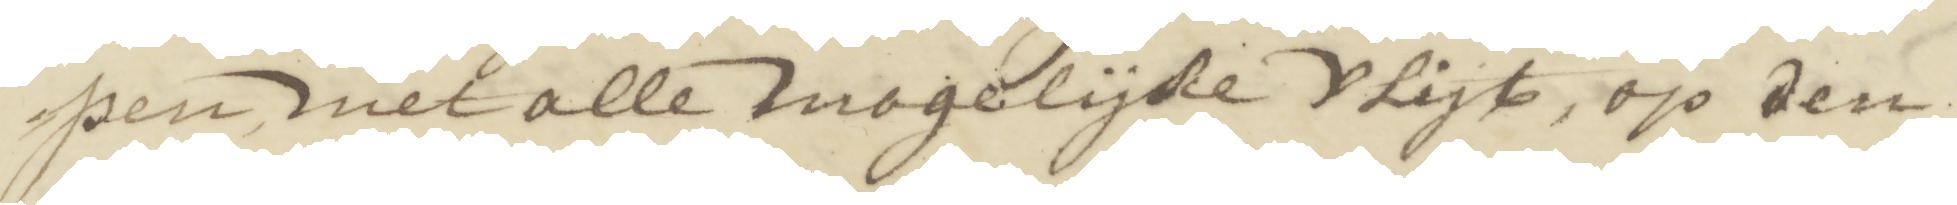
pen, met alle mogelijke vlijt, op den
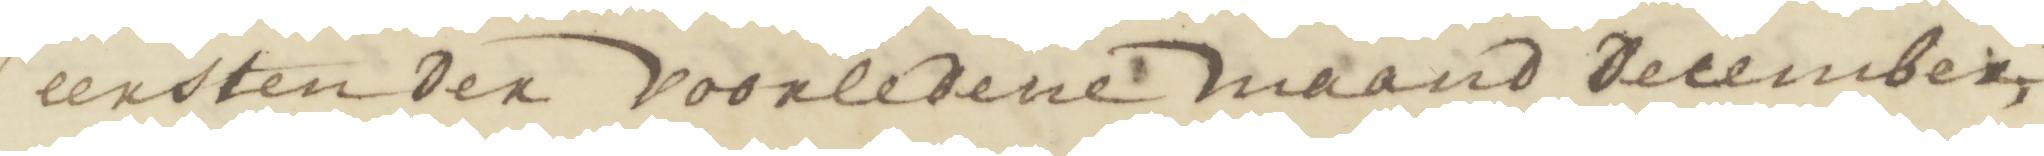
eersten der voorledene maand december,
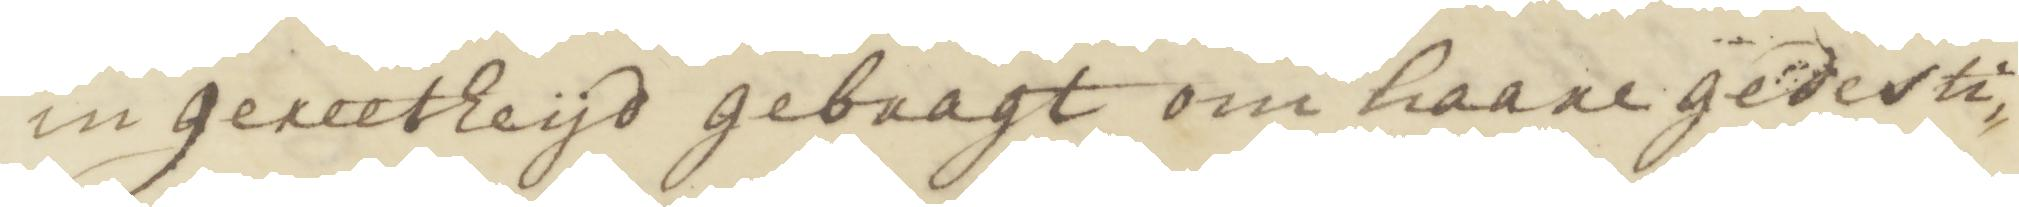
in gereetheijd gebragt om haare gedesti„
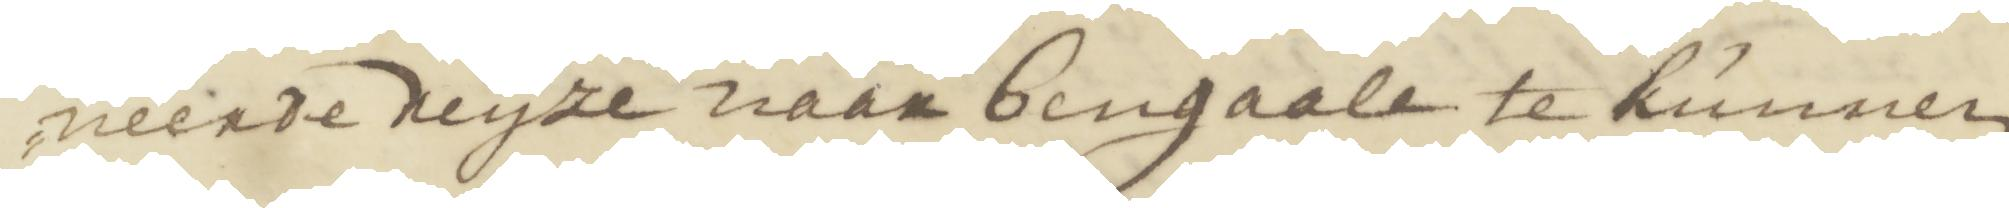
neerde reijze naar bengaale te kunnen
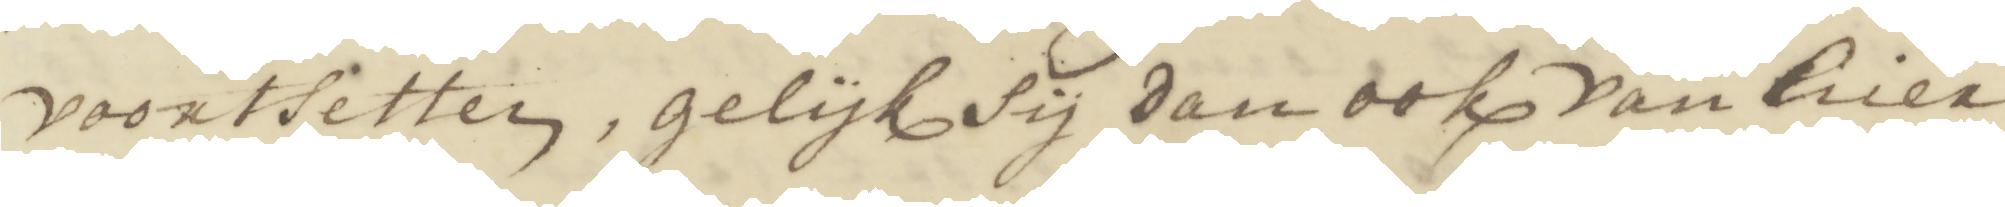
voortsetten, gelijk sij dan ook van hier
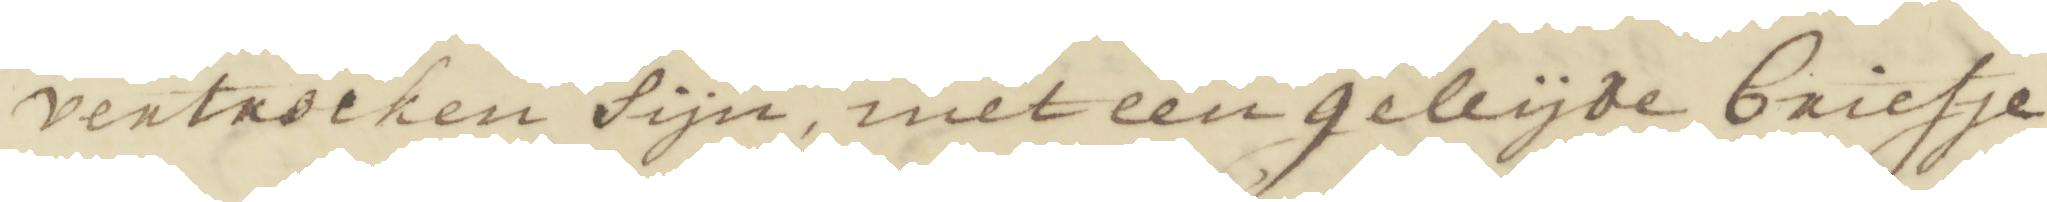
vertrocken sijn, met een geleijde briefje,
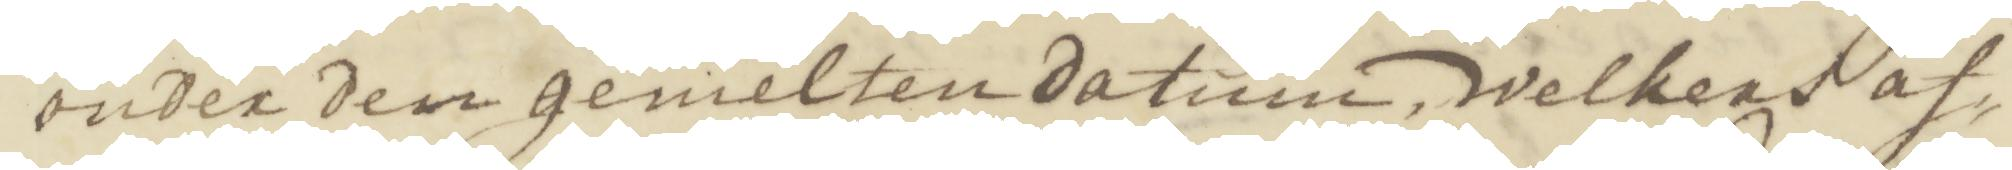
onder den gemelten datum, welkers af„
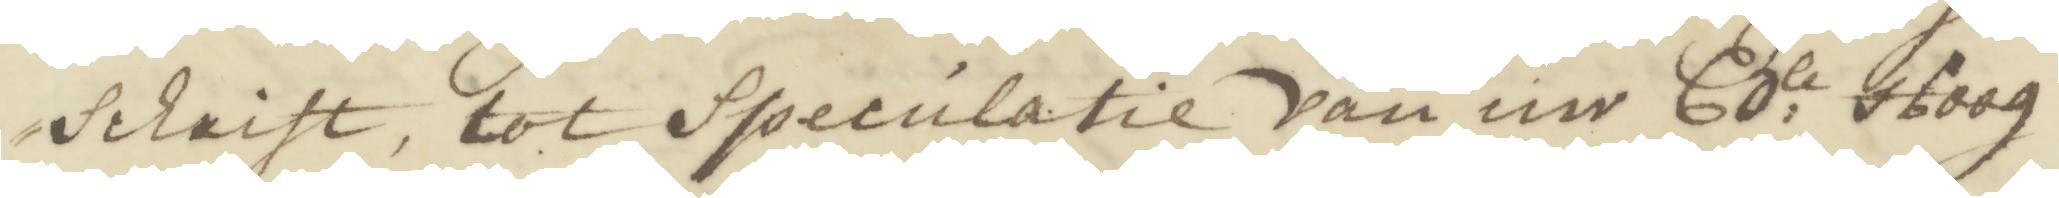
„schrift, tot speculatie van uw Ed:le Hoog
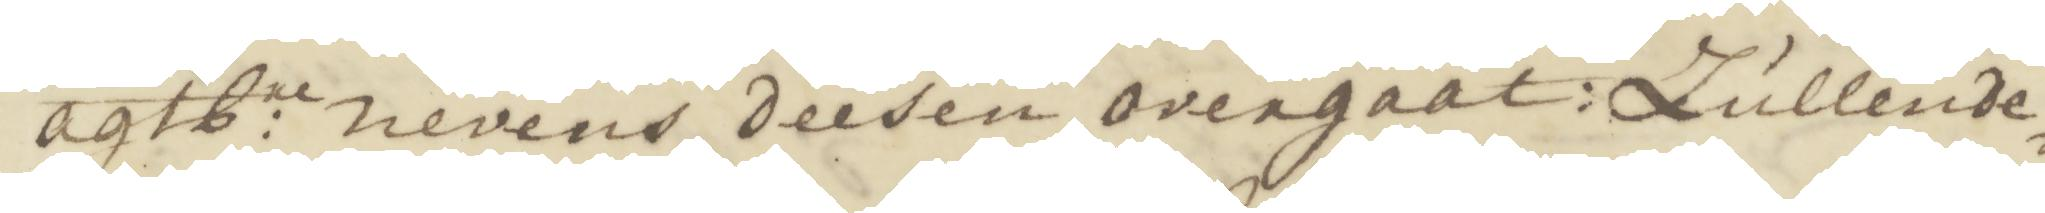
agtb:re nevens deesen overgaat: Zullende
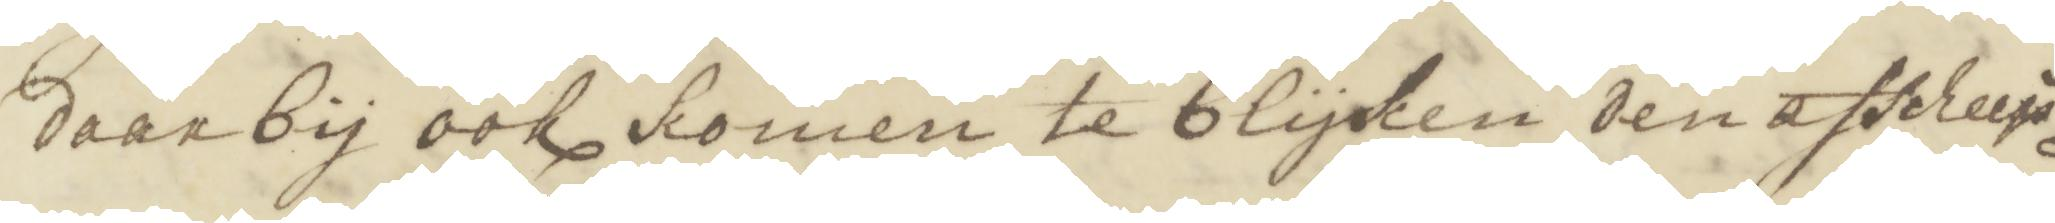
daar bij ook komen te blijcken den afscheep
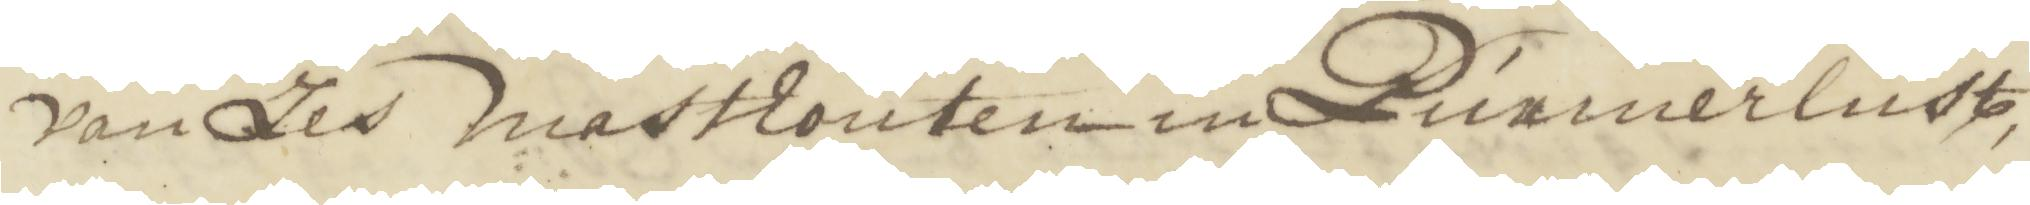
van zes masthouten in Purmerlust,
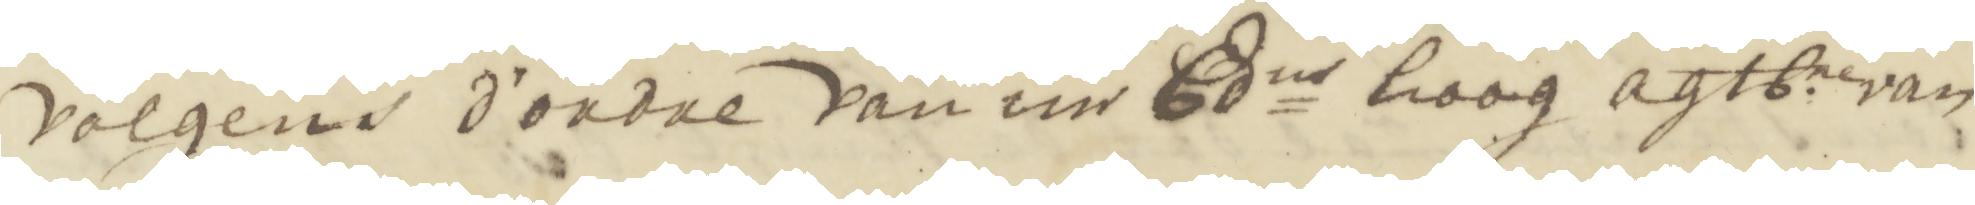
volgens d’ordre van uw Ed=ns hoog agtb:re van
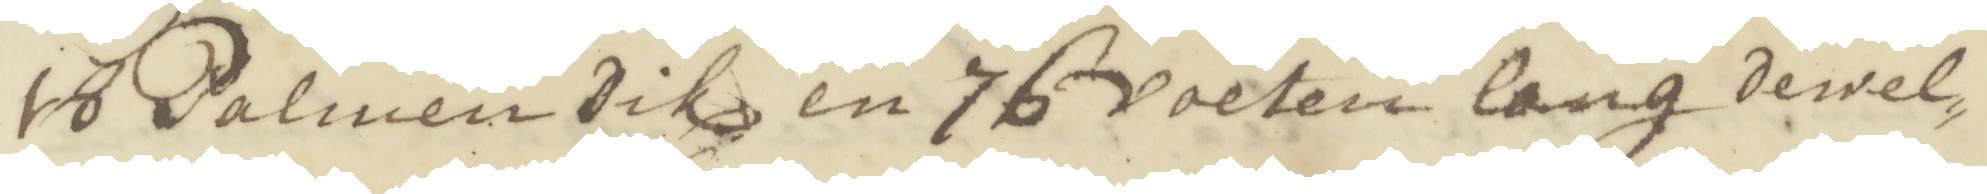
18 Palmen dik en 76 voeten lang dewel„
